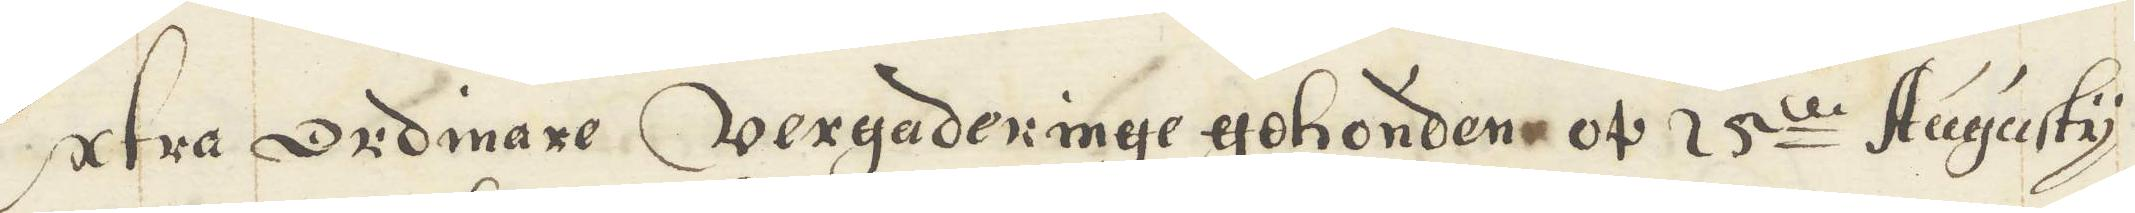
Extra ordinare vergaderinge gehouden op 25=en Augustij
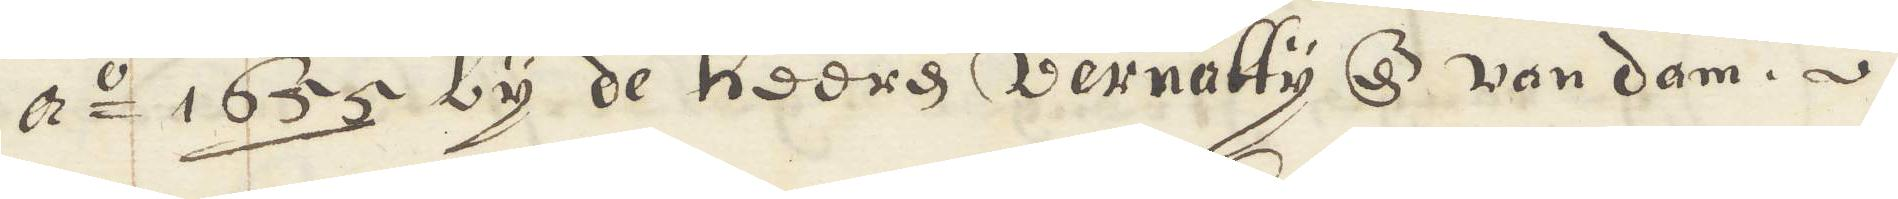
A=o 1655 bij de heeren vernattij ende van dam. ~
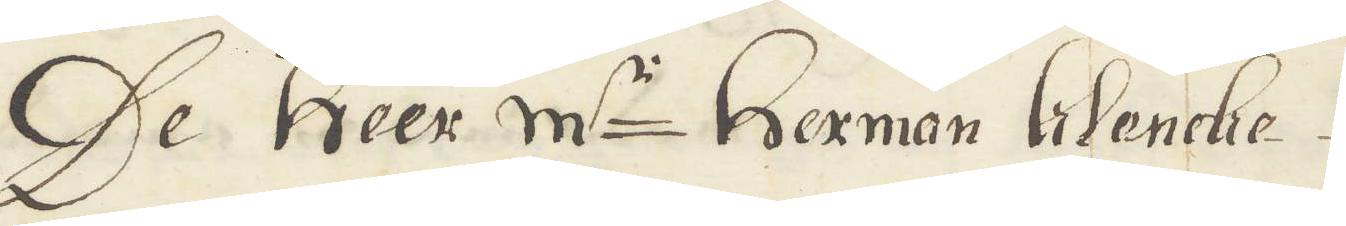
De Heer m=r Herman klencke
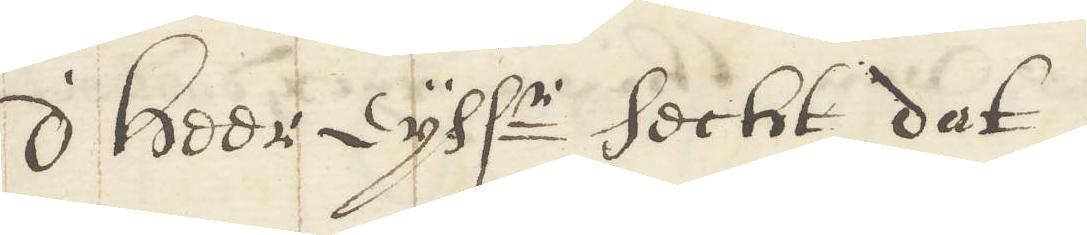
d’ Heer Eijss=r secht dat
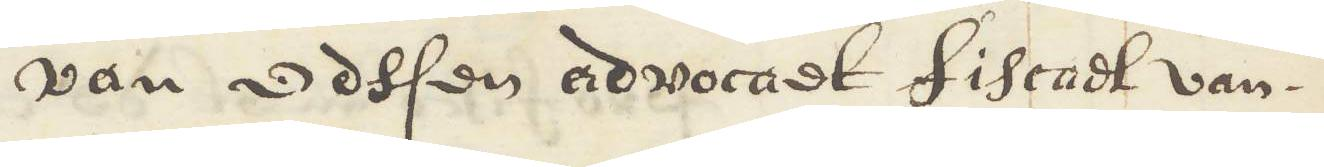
van vossen advocaet fiscael van -
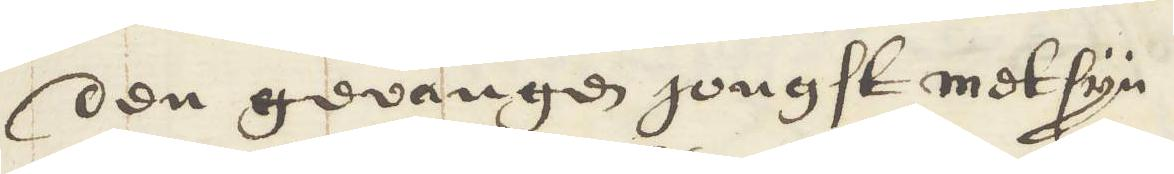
den gevangen jongst met sijn
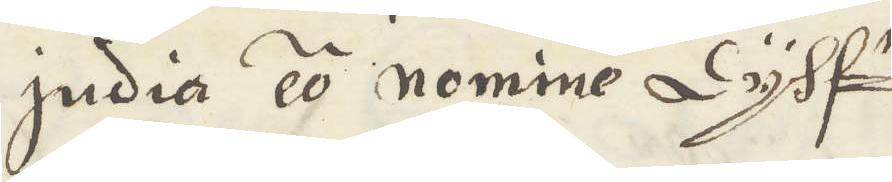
jndia eo nomine Eijss=r
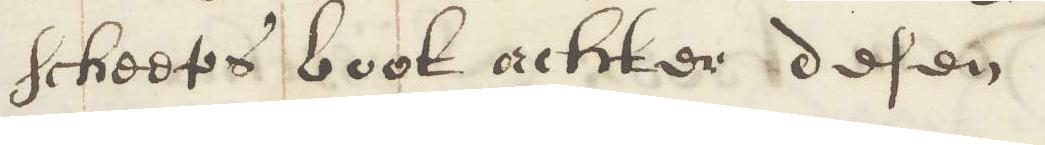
scheeps boot achter desen
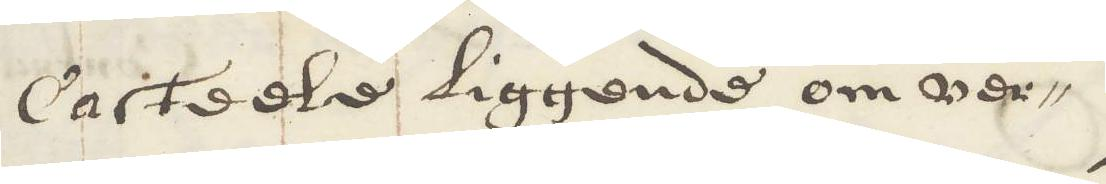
Casteele liggende om ver„
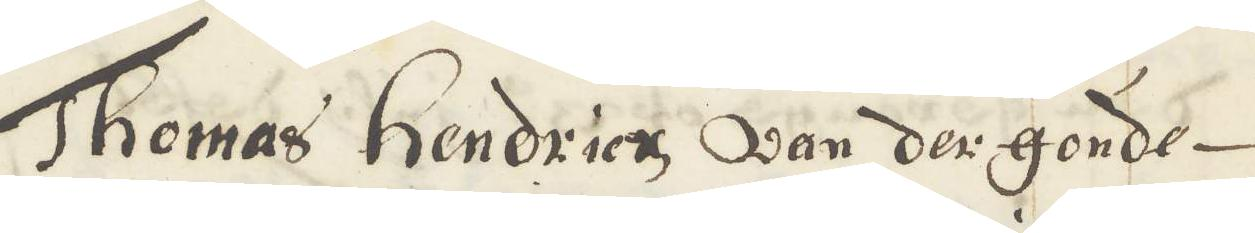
Thomas hendrick an der goude—
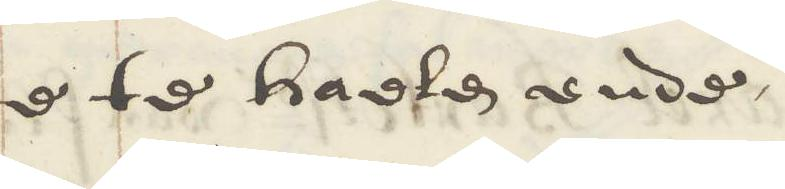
e te haelen ende
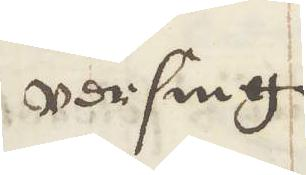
versing
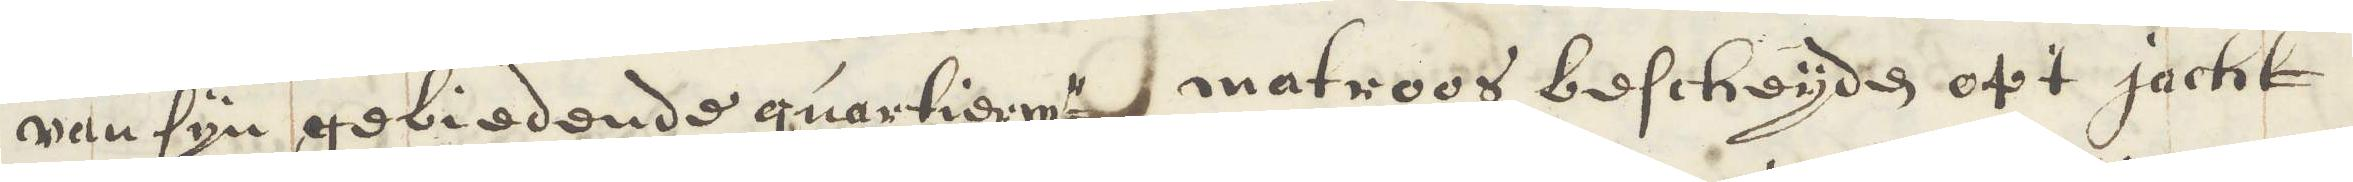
van sijn gebiedende quartierm=r matroos bescheijden op ’t jacht
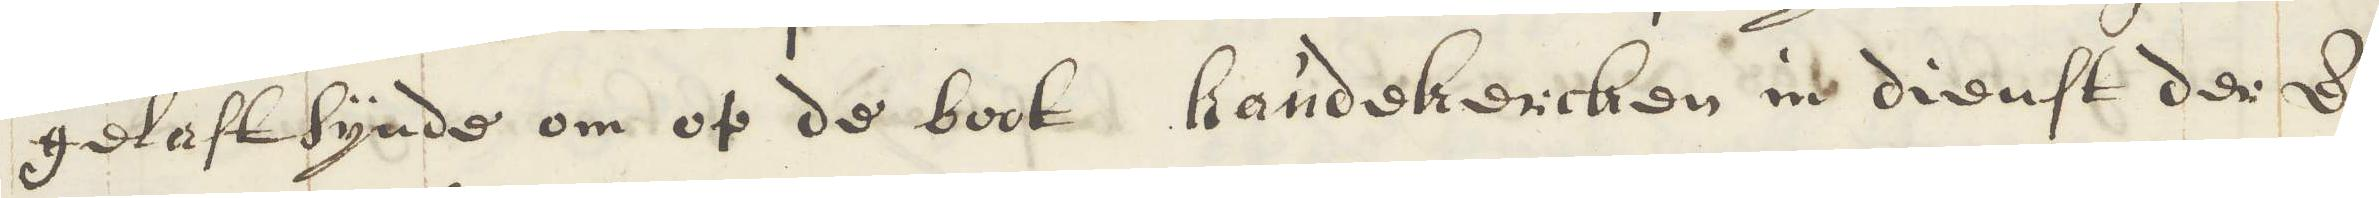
gelast sijnde om op de boot koudekercken in dienst der E:
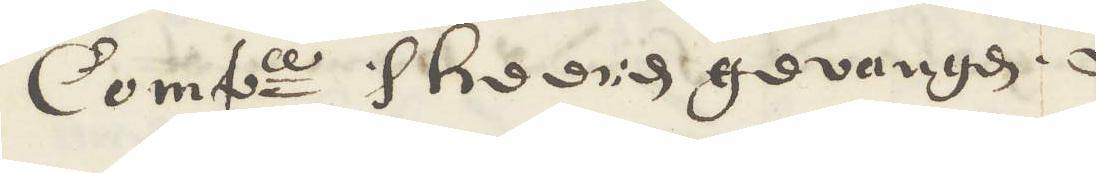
Comp=e 's heeren gevangen.-
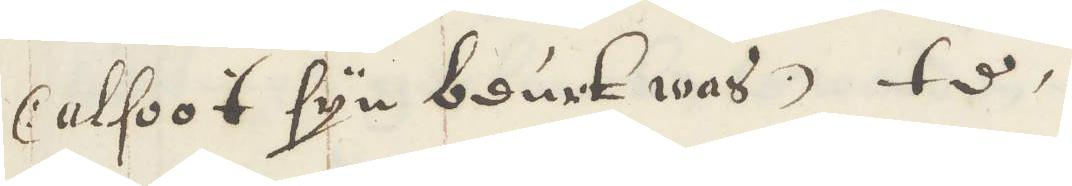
(: alsoo ’t sijn beurt was.) te,
